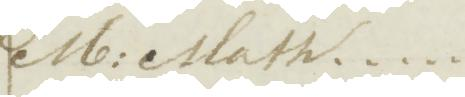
M: Math. . . . . . .
